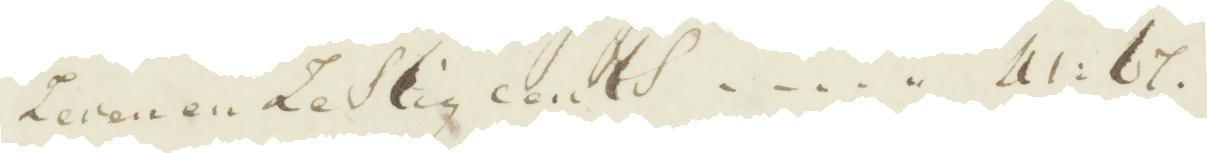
zeven en Zestig cents - - - . .. „ 41:67.
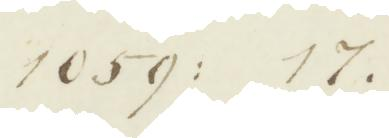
1059: 17.
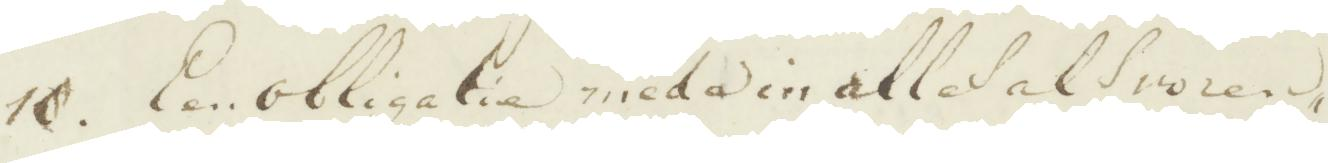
18. Een obligatie mede in alles als voren„
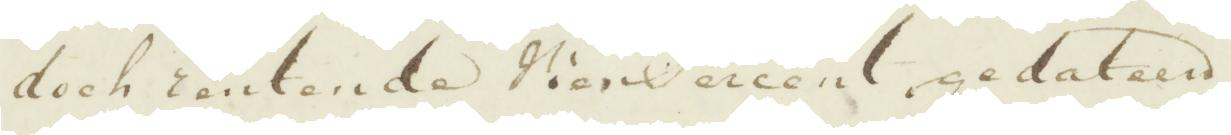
doch rentende Vier Percent, gedateerd
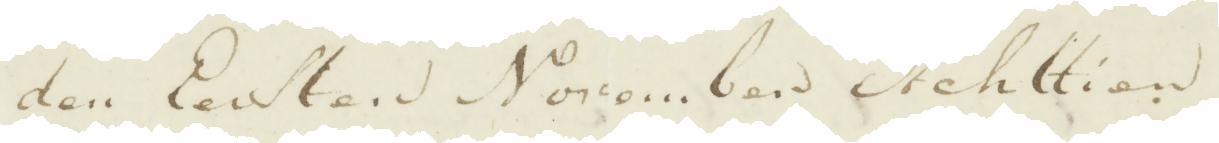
den Eersten November Achttien
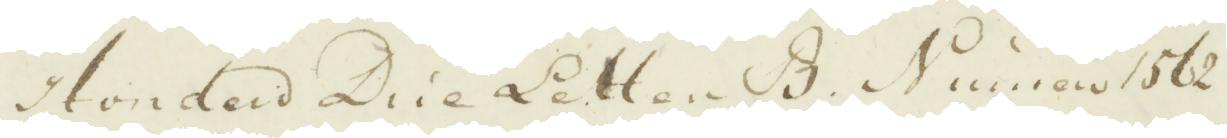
Honderd Drie Letter B. Numero 1562
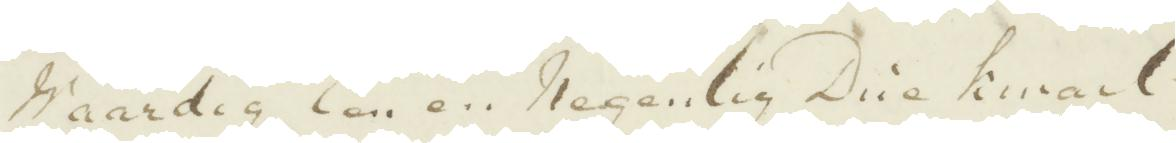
Waardig Een en Negentig Drie kwart
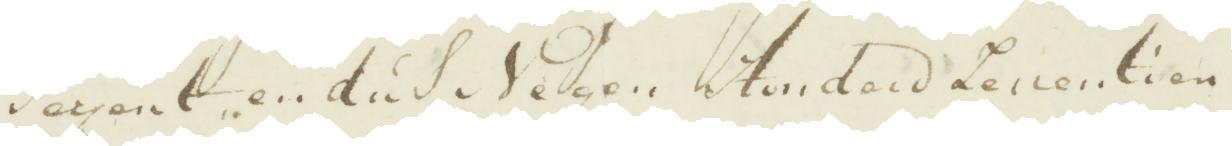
Percent, en dus Negen Honderd Zeventien
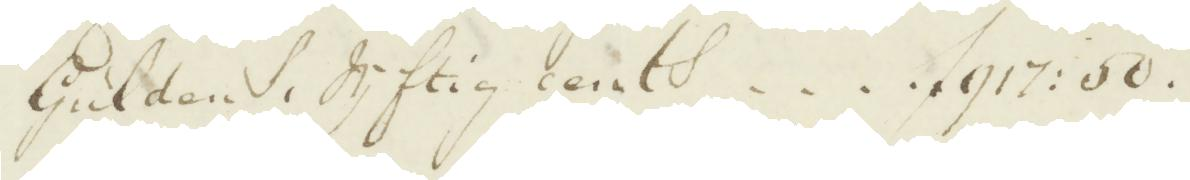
Guldens, Vijftig Cents . . . . ƒ917:50.
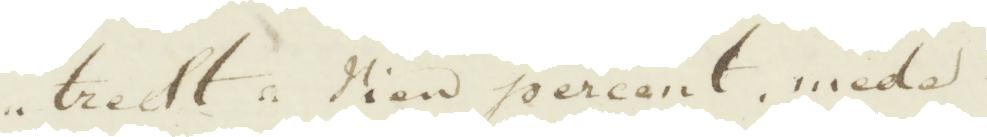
„trest a Vier percent, mede
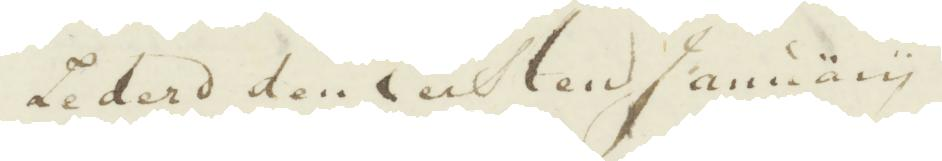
zederd den Eersten Januarij
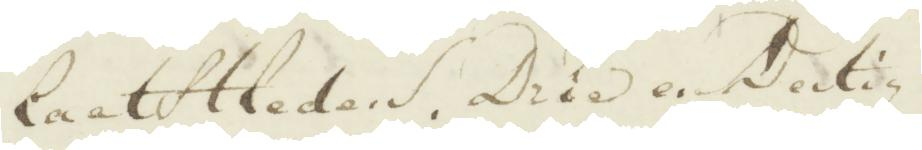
laatstleden, Drie en Dertig
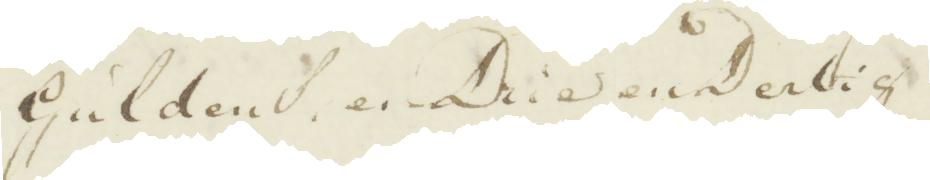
Guldens, en Drie en Dertig
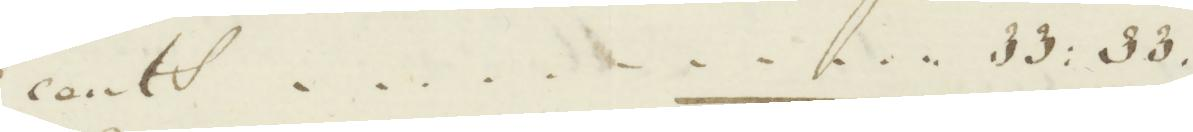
cents . . . . . - - - . . .. 33: 33.
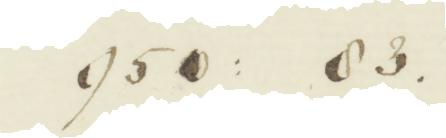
950: 83.
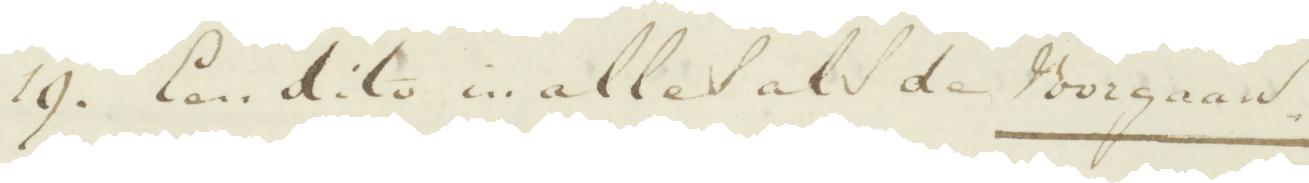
19. Een dito in alles als de voorgaan„
